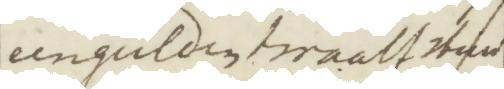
een gulden twaalf stuivr
